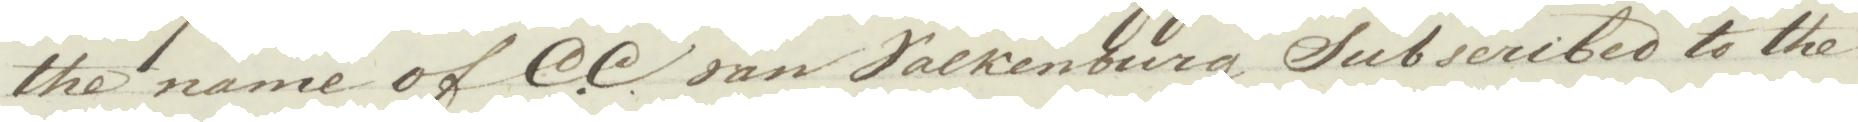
the name of C.C. van Valkenburg subscribed to the
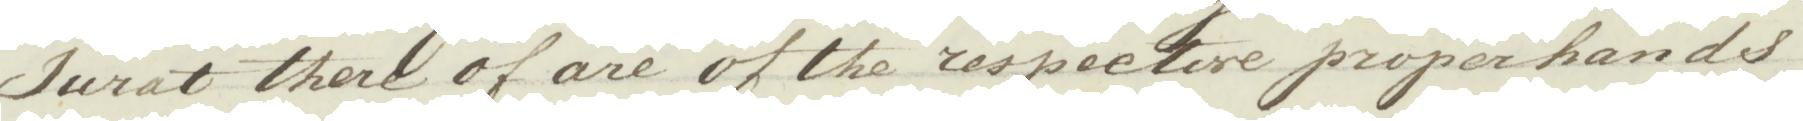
Iurat there of are of the respective proper hands
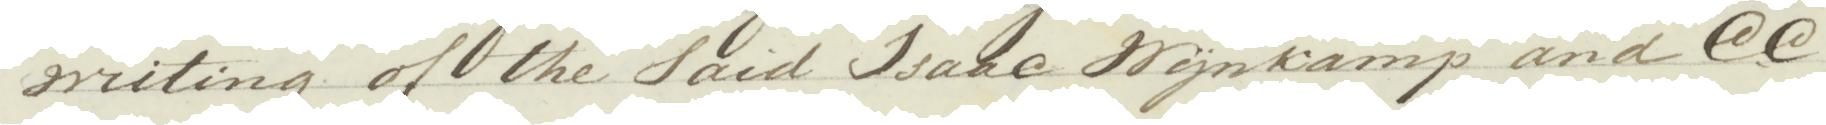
writing of the said Isaac Wijnkamp and C.C
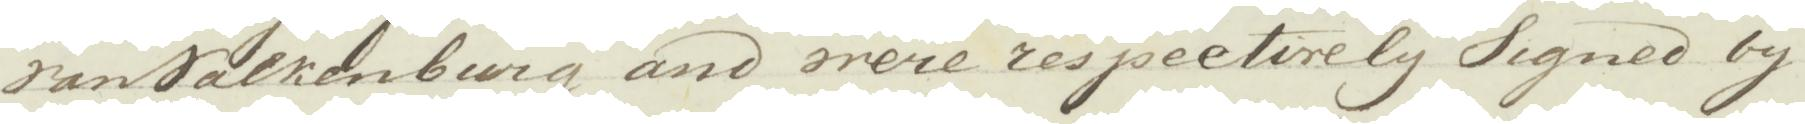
van Valkenburg and were respectively signed by
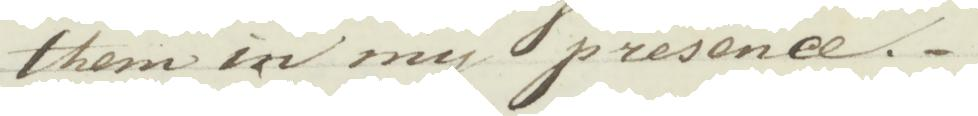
them in my presence.-
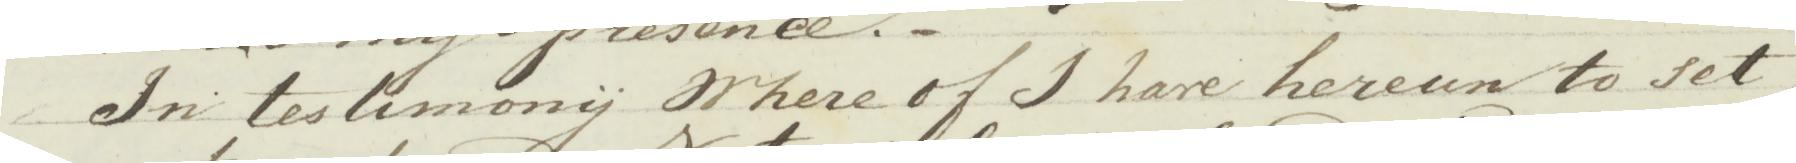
In testimonij Where of I have hereun to set
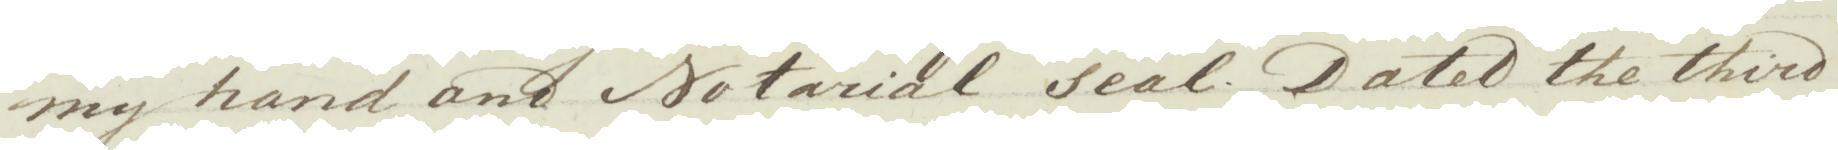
my hand and Notarial seal Dated the third
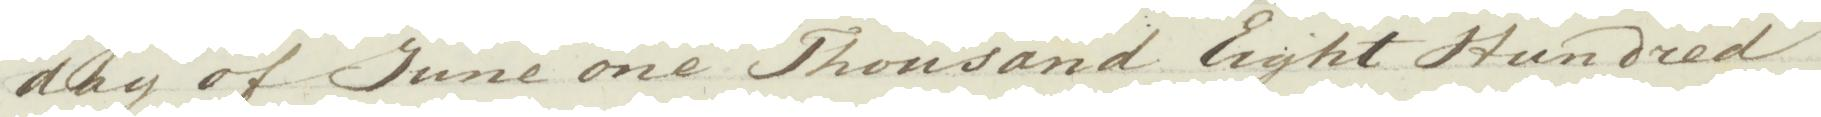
day of Iune one Thousand Eight Hundred
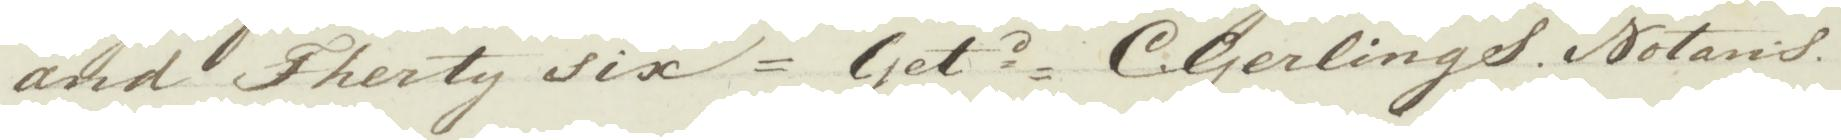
and Therty six = Get=d = C. Gerlings. Notaris.
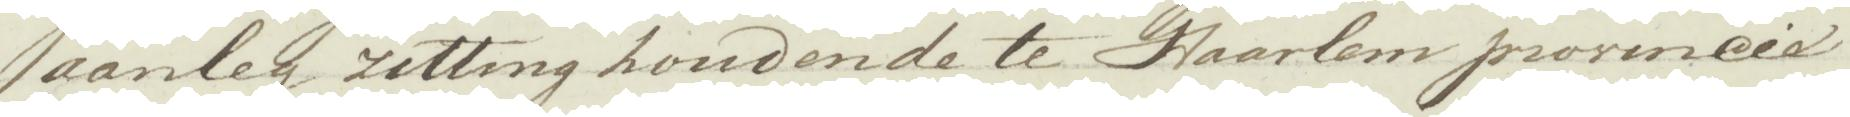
aanleg zitting houdende te Haarlem provincie
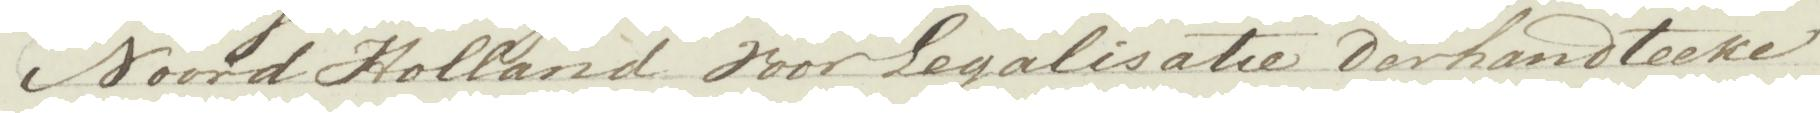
Noord Holland voor Legalisatie derhandteeke
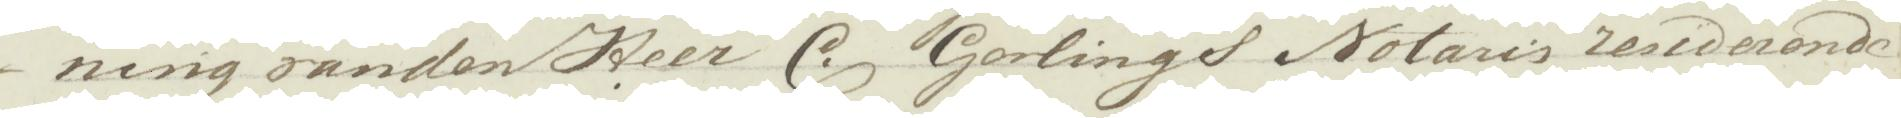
- ning van den Heer C. Gerlings Notaris residerende
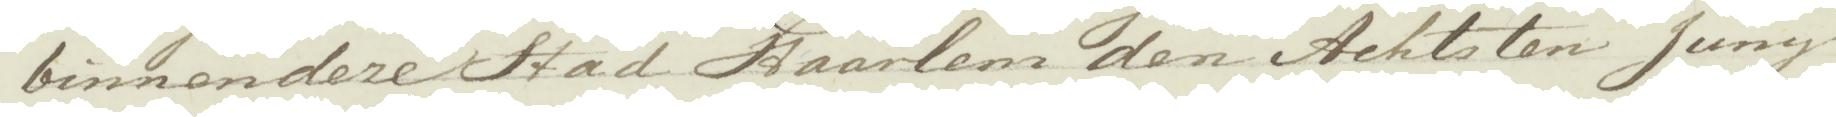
binnen deze Stad Haarlem den Achtsten Juny
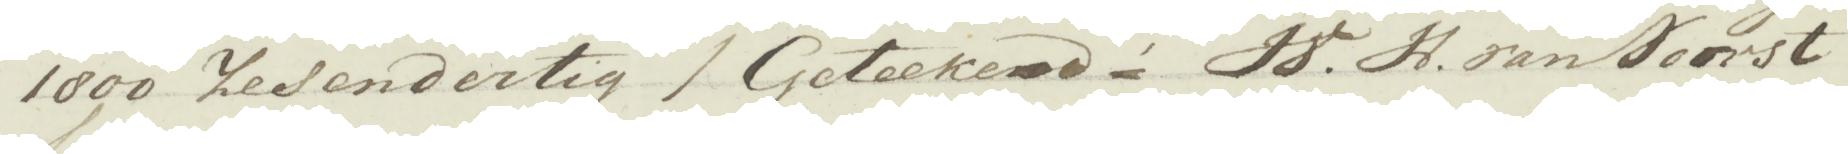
1800 zesendertig / Geteekend =' W.H. van Voorst
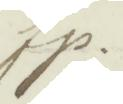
fp.
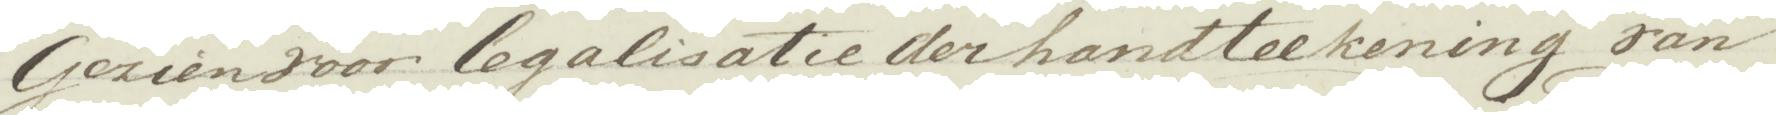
Gezien voor legalisatie der handteekening van
